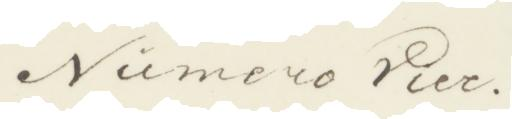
Numero Vier.
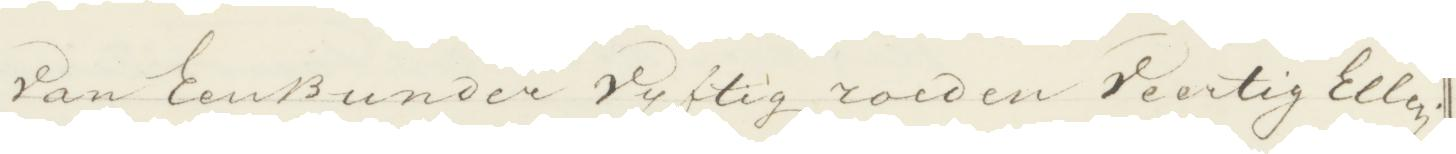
van Een Bunder Vyftig roeden Veertig Ellen.
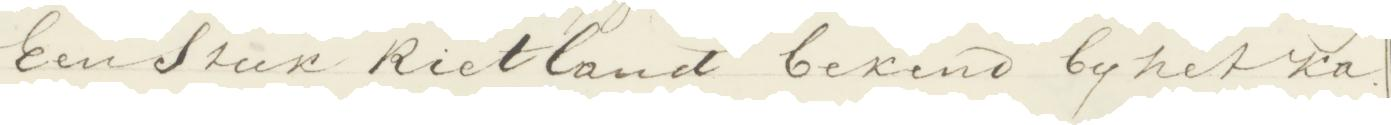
Een stuk Rietland bekend by het ka„
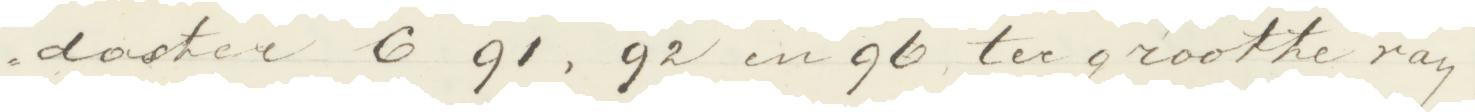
„daster C 91, 92 en 96, ter grootte van
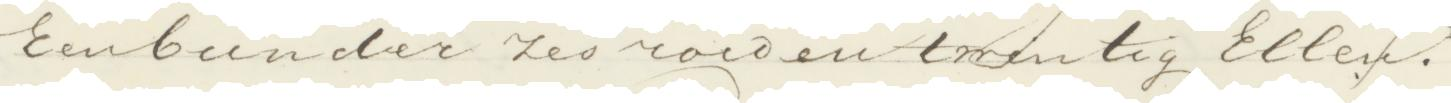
Een bunder zes roeden twintig Ellen.
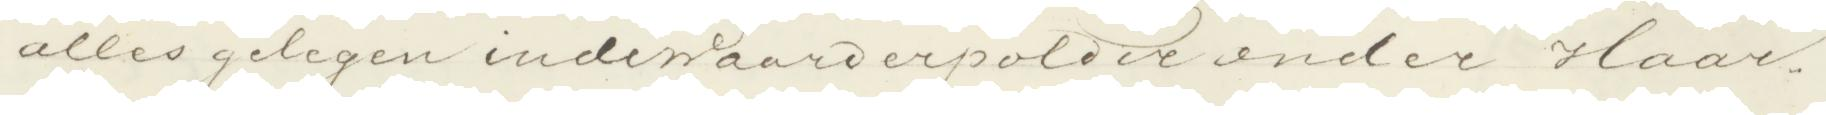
alles gelegen inde Waarderpolder onder Haar„
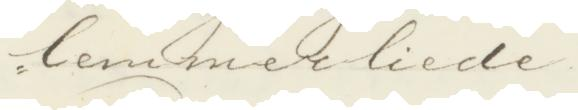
„lemmerliede
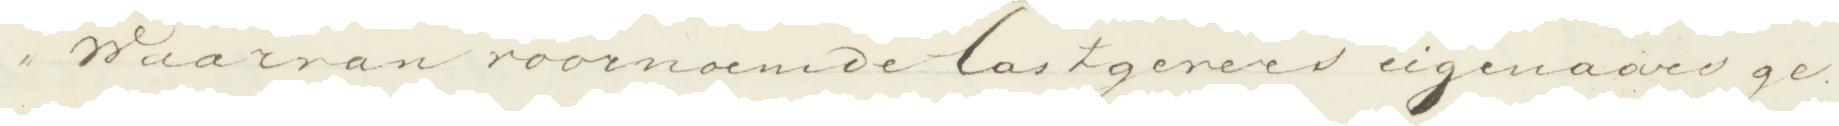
„ Waarvan voornoemde lastgevers eigenaars ge
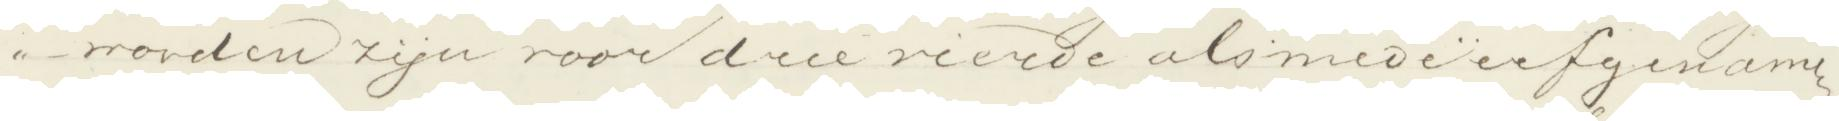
„worden zijn voor drie vierde als mede erfgenamen
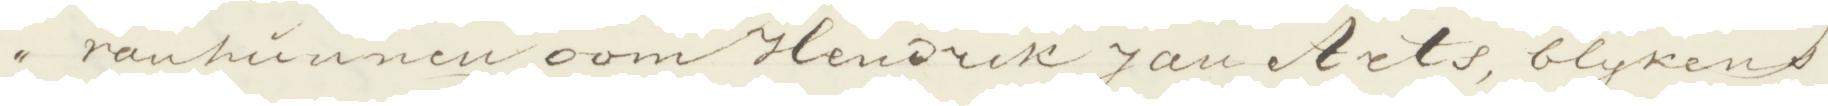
„ van hunnen oom Hendrik Jan Arts, blykens
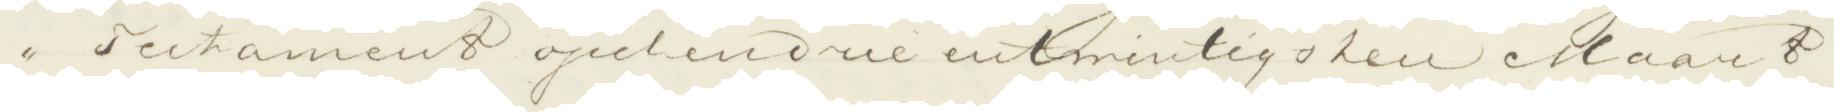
„ Testament opden drie entwintigsten Maart
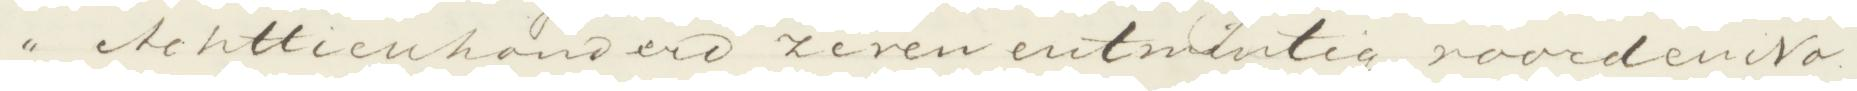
„ Achttienhonderd zeven entwintig voorden No.
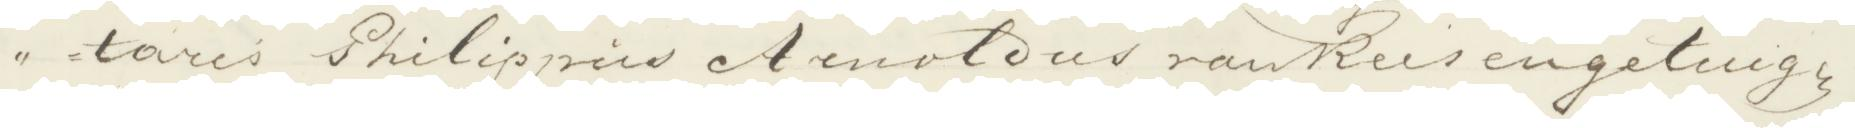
„ „taris Philippus Arnoldus van Rees en getuigen
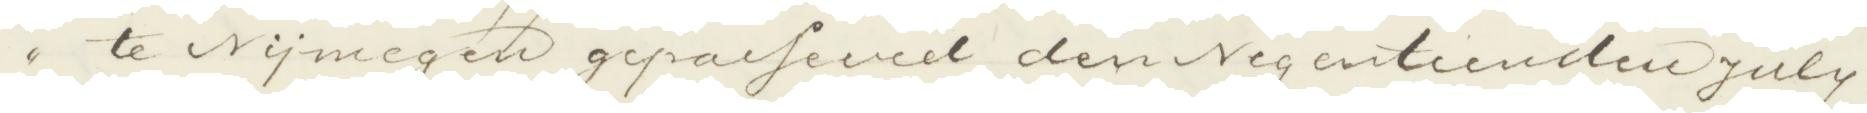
„ te Nijmegen gepasseerd, den Negentienden July
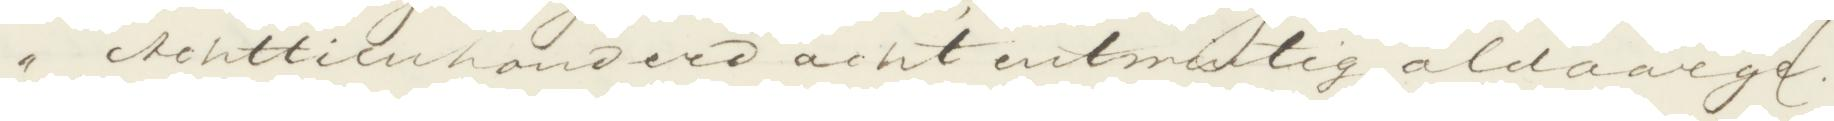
„ Achttienhonderd acht entwintig aldaar ge
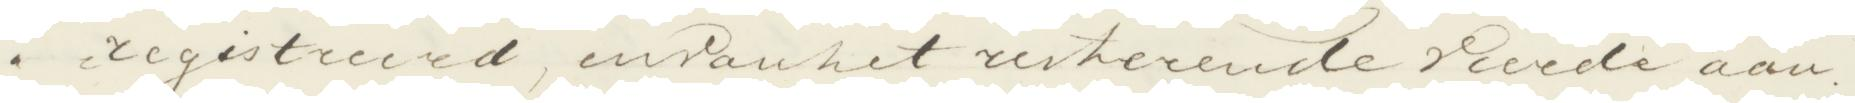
„ „registreerd, en van het resterende vierde aan.
